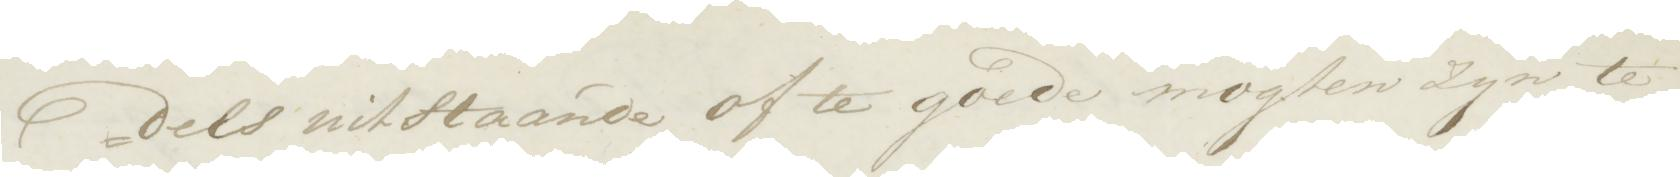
dels uitstaande of te goede mogten zyn te
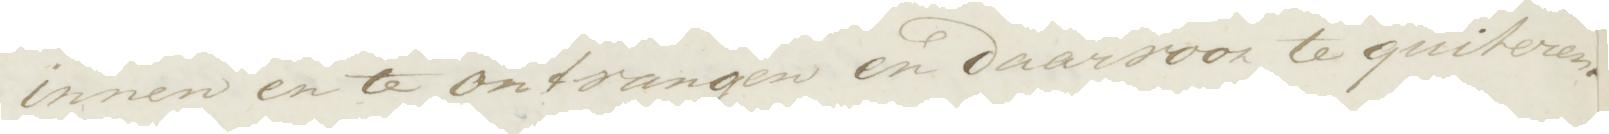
innen en te ontvangen en daarvoor te quiteren.
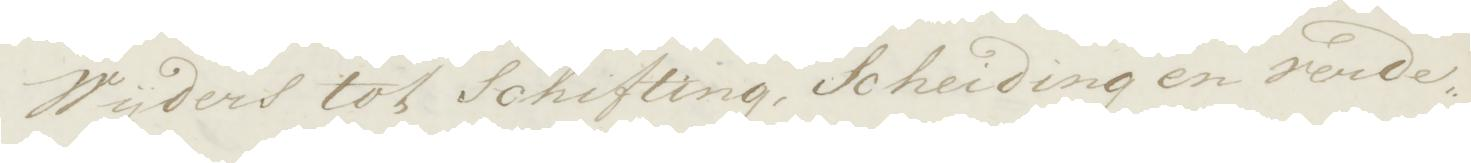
Wijders tot schifting, scheiding en verde„
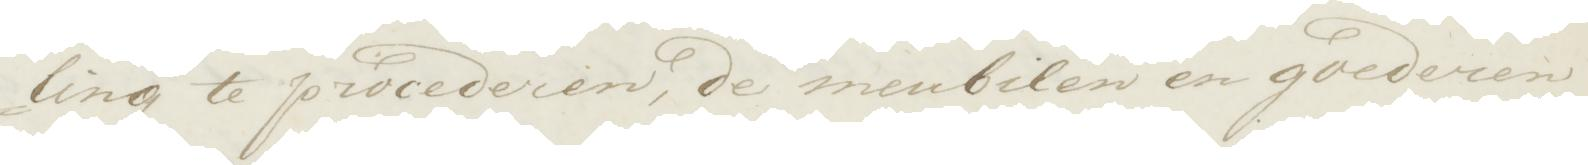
„ling te procederen, de meubelen en goederen
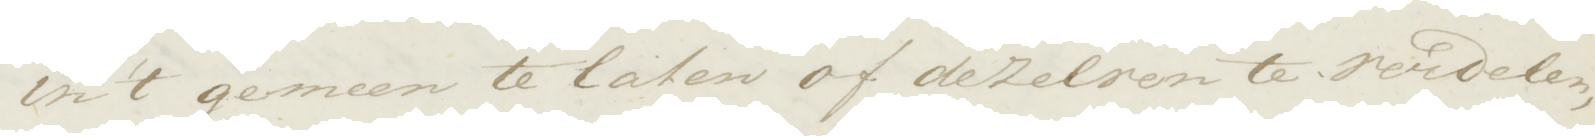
in ’t gemeen te laten of dezelven te verdelen,
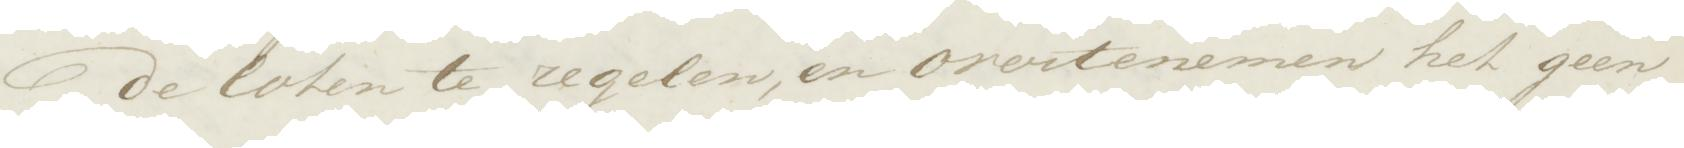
de loten te regelen, en overtenemen het geen
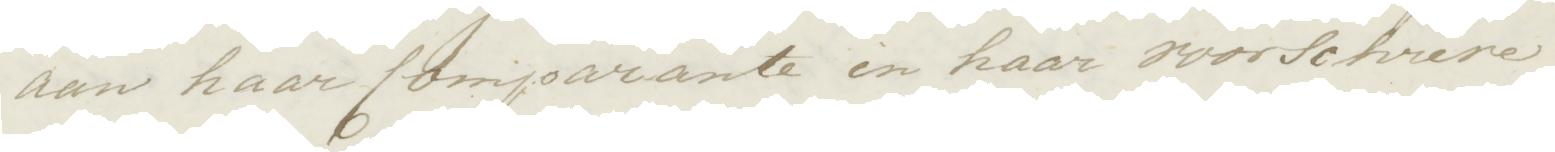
aan haar Comparante in haar voorschreve
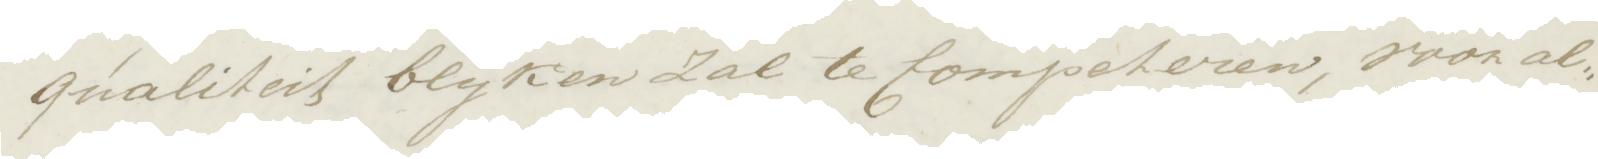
qualiteit blijken zal te Competeren, voor al„
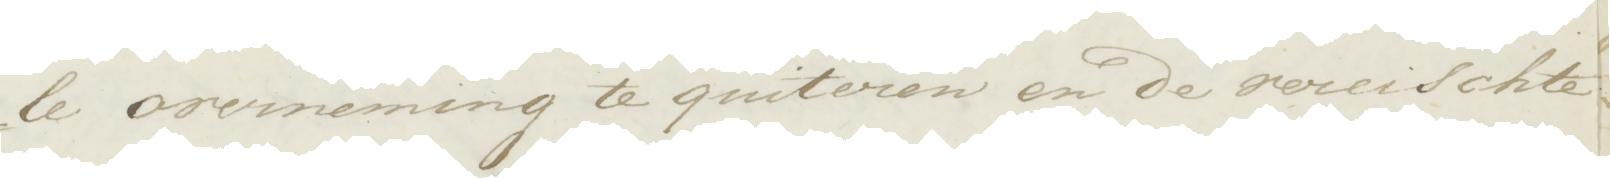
„le overneming te quiteren en de vereischte
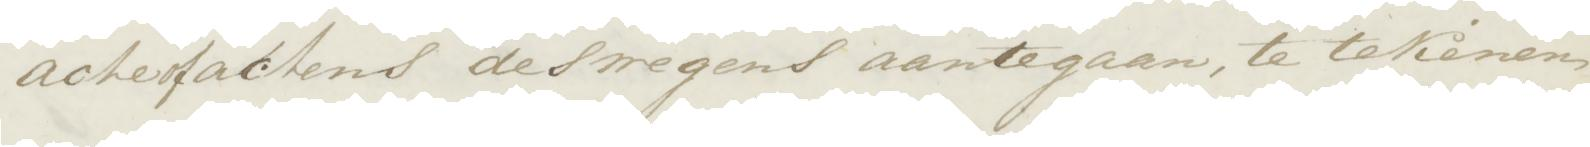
actefactens deswegens aantegaan, te tekenen,
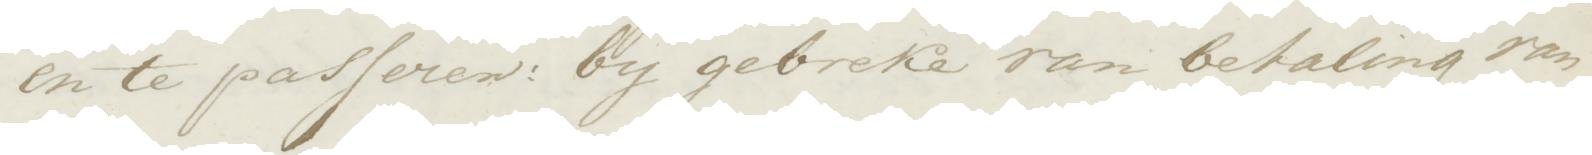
en te passeren: by gebreke van betaling van
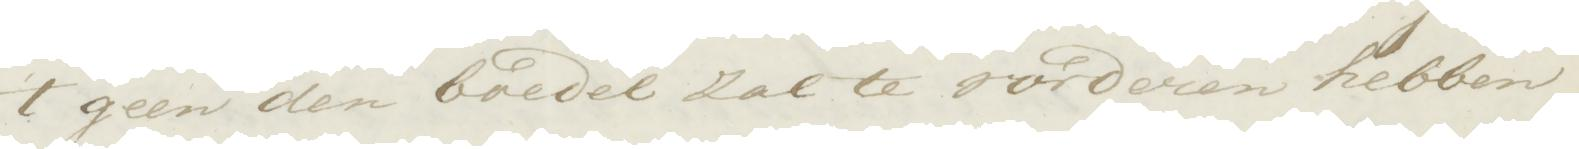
’t geen den boedel zal te vorderen hebben
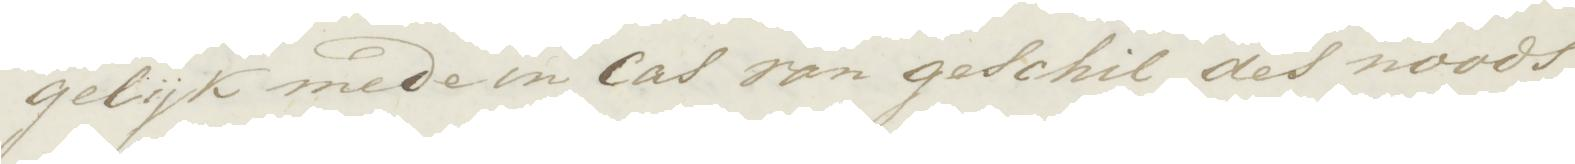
gelijk mede in cas van geschil des noods
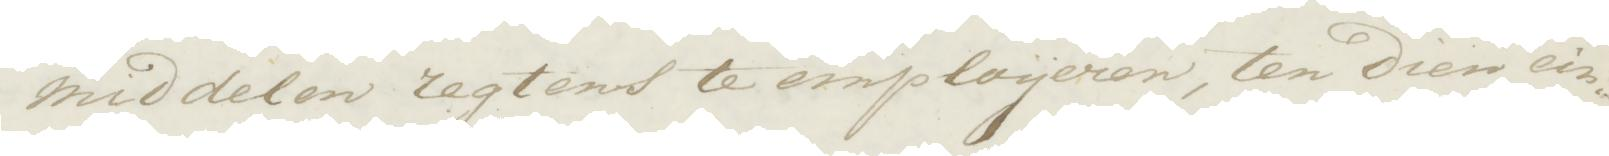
middelen regtens te emploijeren, ten dien ein„
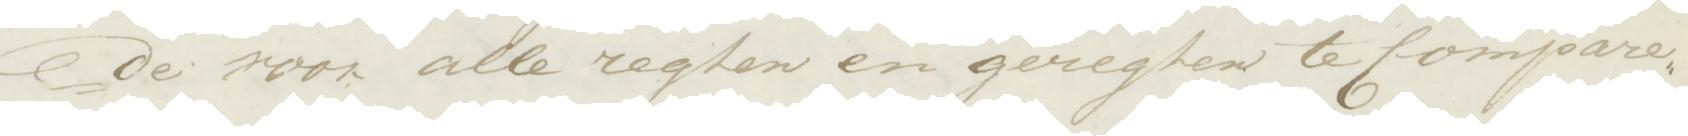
„de voor alle regten en geregten te Compare„
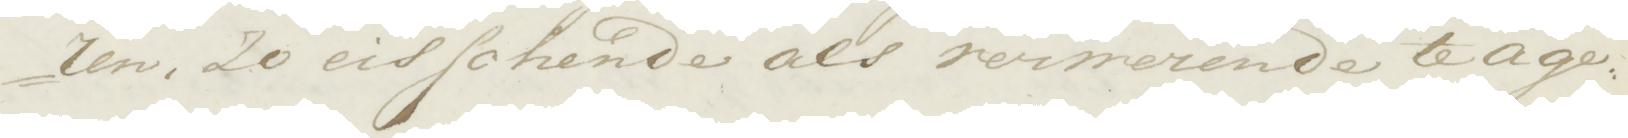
„ren, zo eisschende als vermerende te age„
